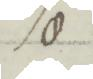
/8
